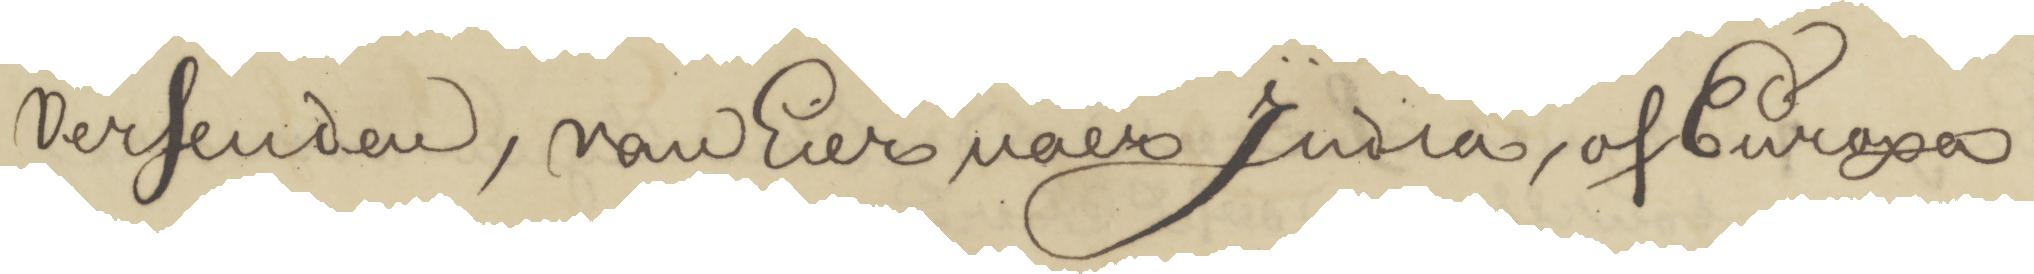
versenden, van hier naer Jndia, of Europa
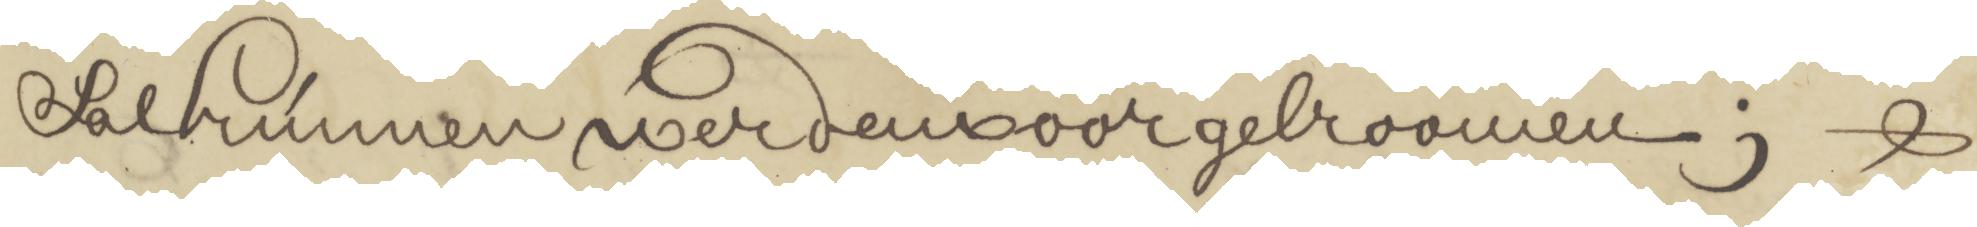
sal kunnen werden voorgekoomen;
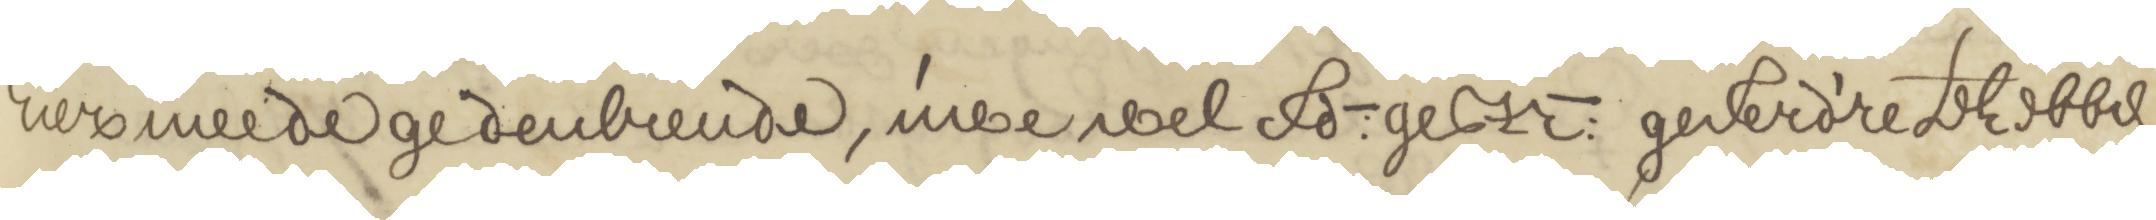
hier meede gedenkende, uwe wel Ed: gestr: geEerd're te hebben
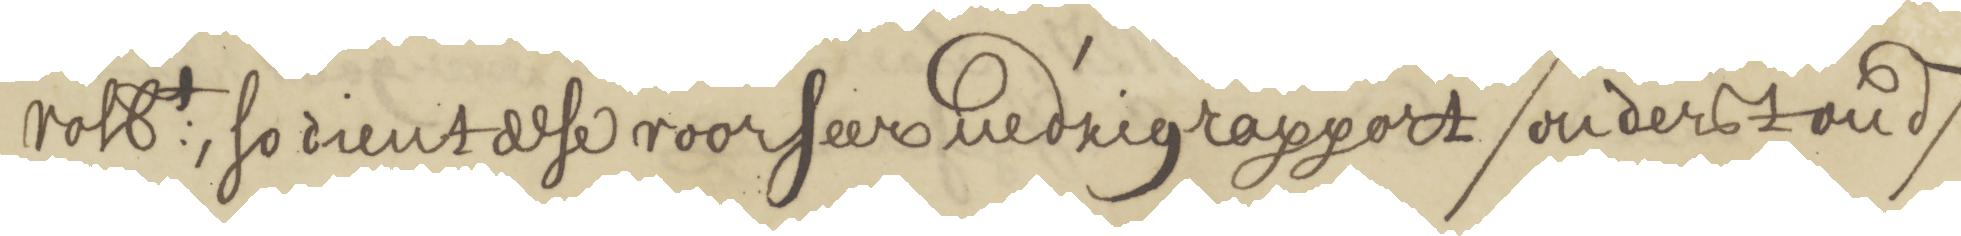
volb:t, so dient dese voor seer nedrig rapport / onderstond /
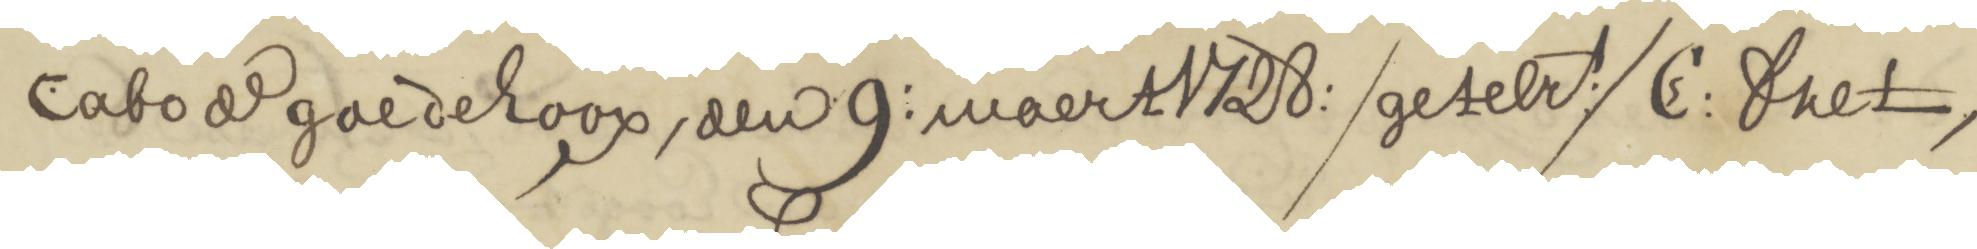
cabo de goedehoop, den 9: maert 1728: /getek:t/ C: fret,
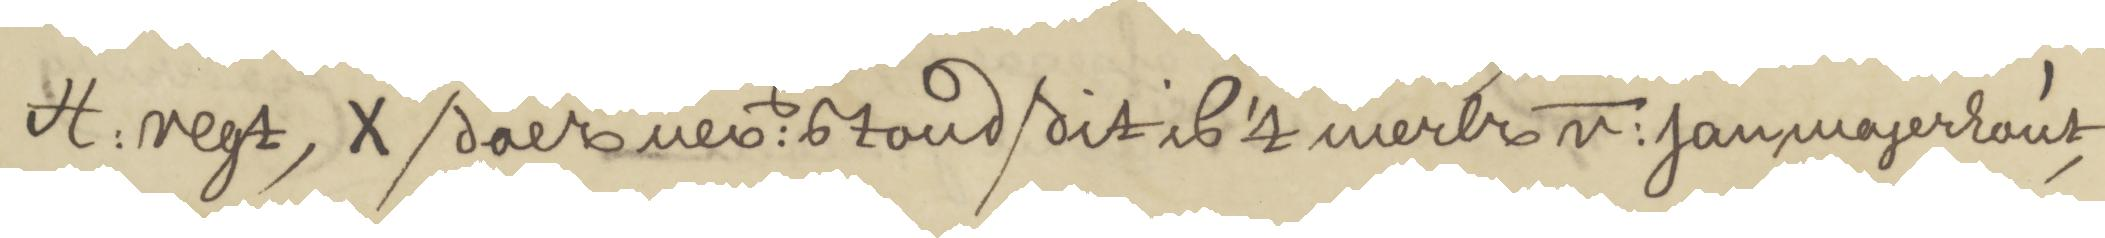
H: regt, X /daer nev:s stond/ dit is ’t merk v: jan majerhout,
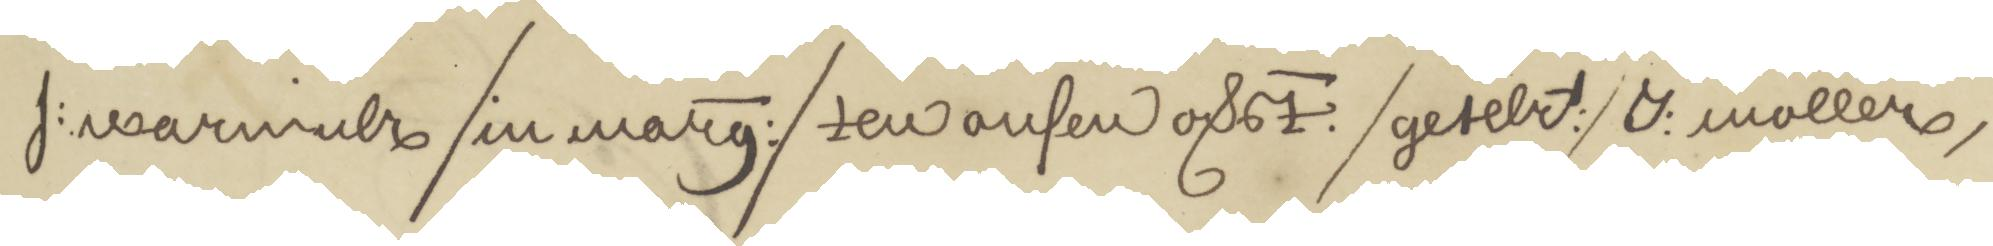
j: warnink /in marg:/ ten onsen overst. /getek:t/ I: moller,
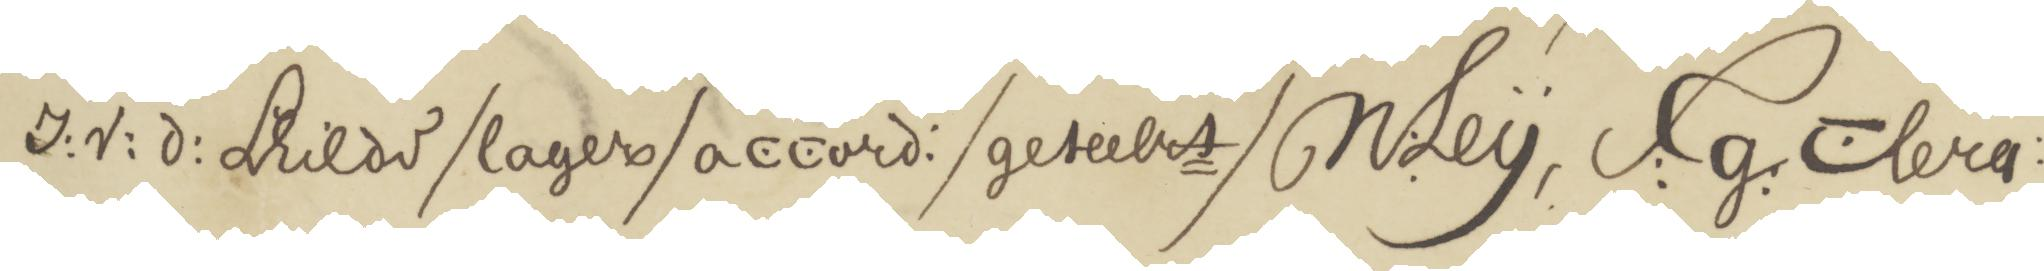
I: v: d: schilds /lager/ accord:t / geteek=t / n: Leij, E: g: Clerq
